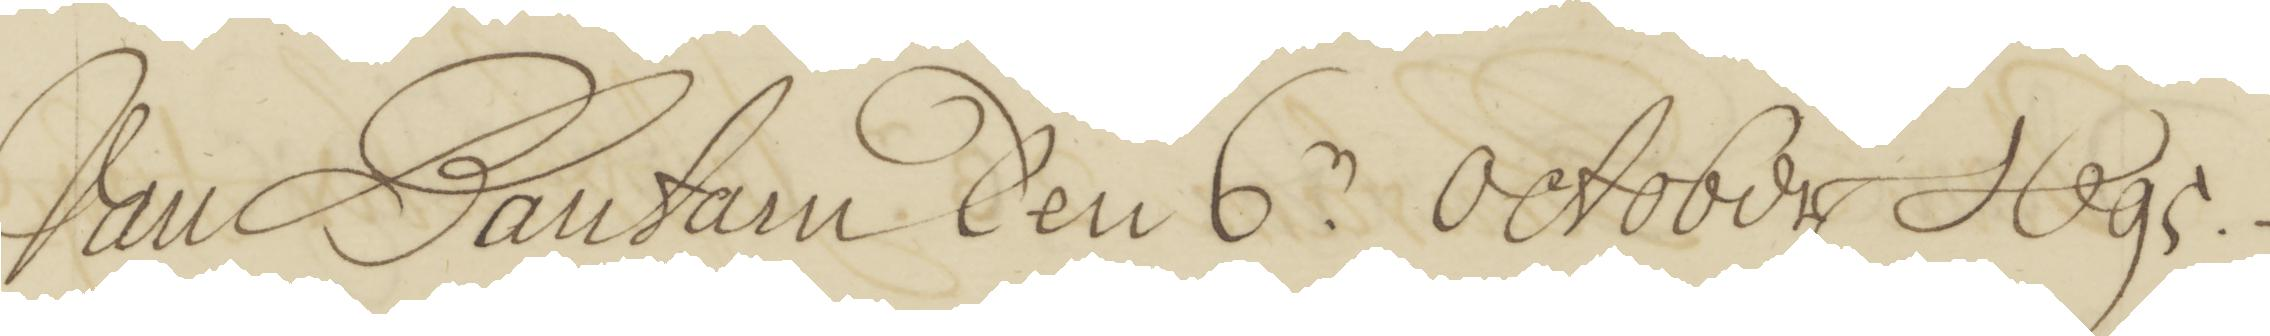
Van Bantam den 6.en october 1695.
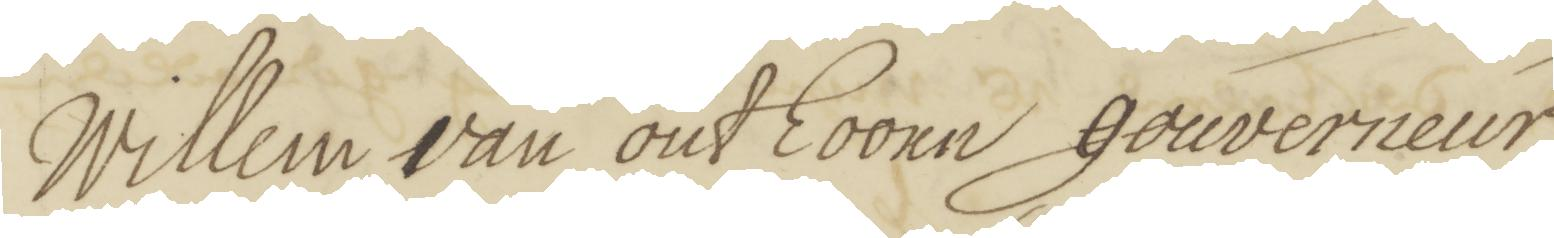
willem van outhoorn gouverneur
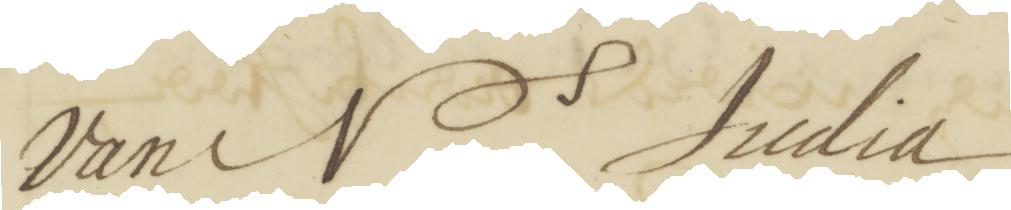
van N.s India
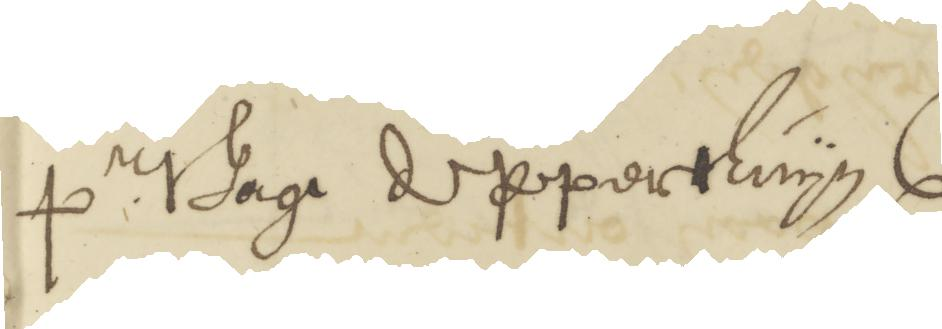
p:r 't Jagt de peperthuijn
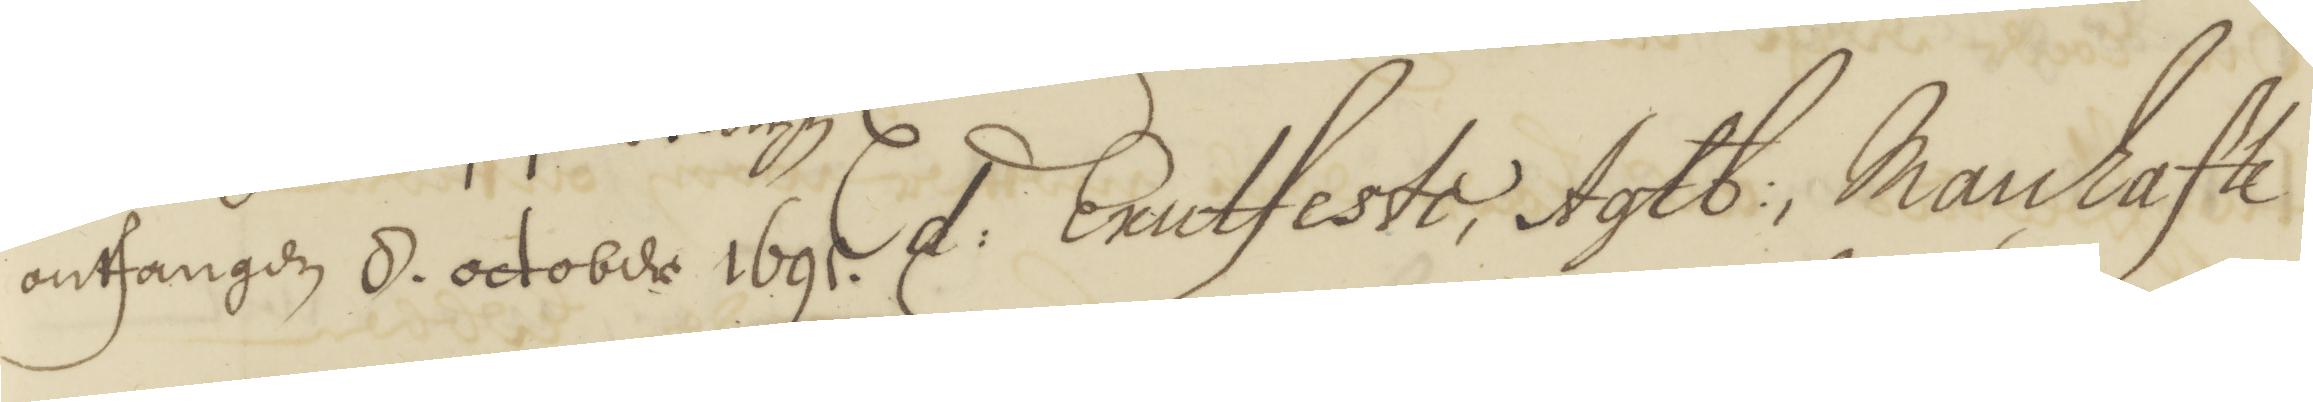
ontfangen 8. october 1695. Ed: Erntfeste, Agtb:, Manhafte
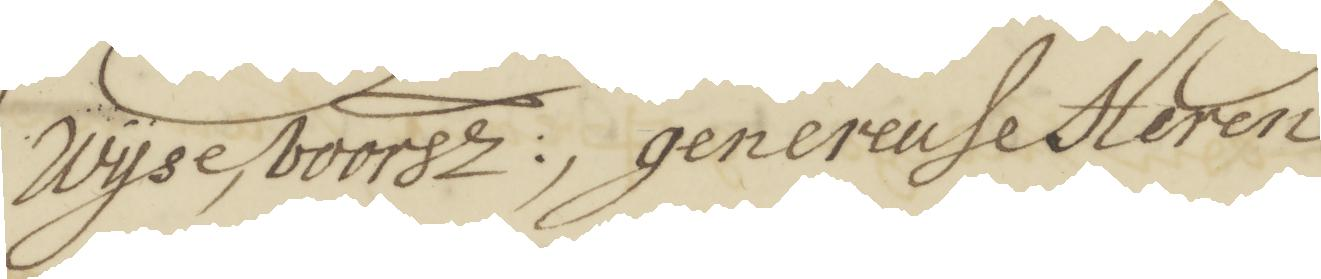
wijse, voorsz:, genereuse Heren
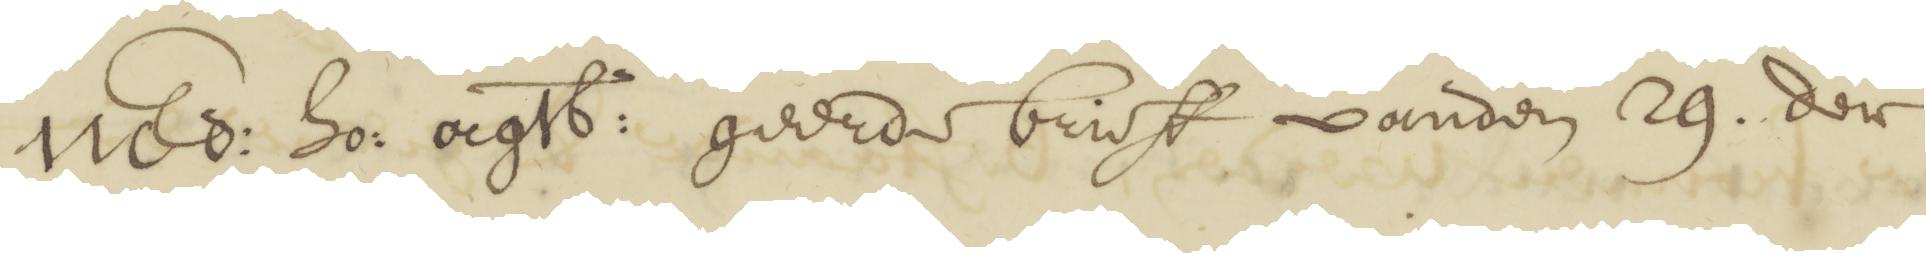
UEd: ho: agtb: geerde brieff vanden 29. der
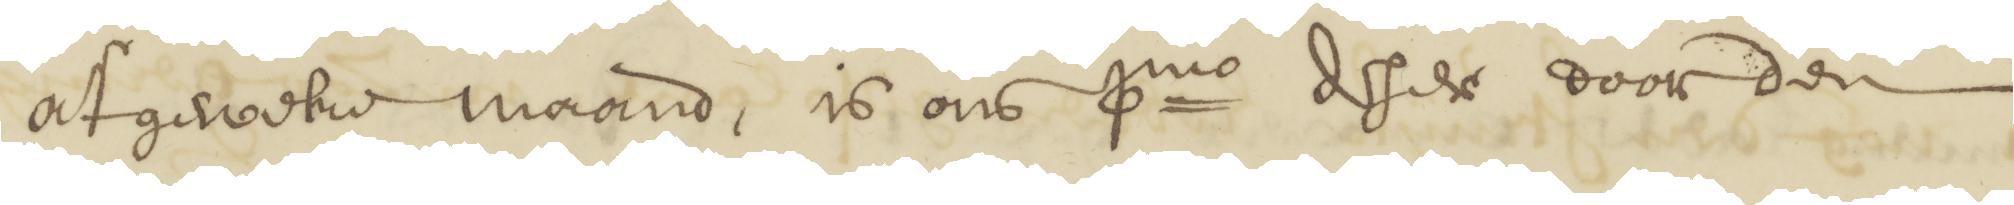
afgeweke maand, is ons p=mo deser door den
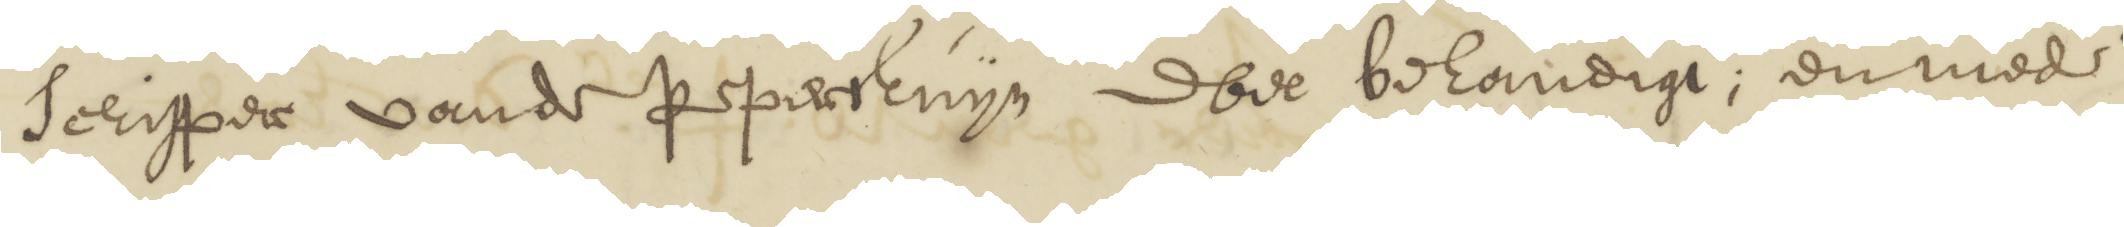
schipper vande peperthuijn wel behandigt; en mede
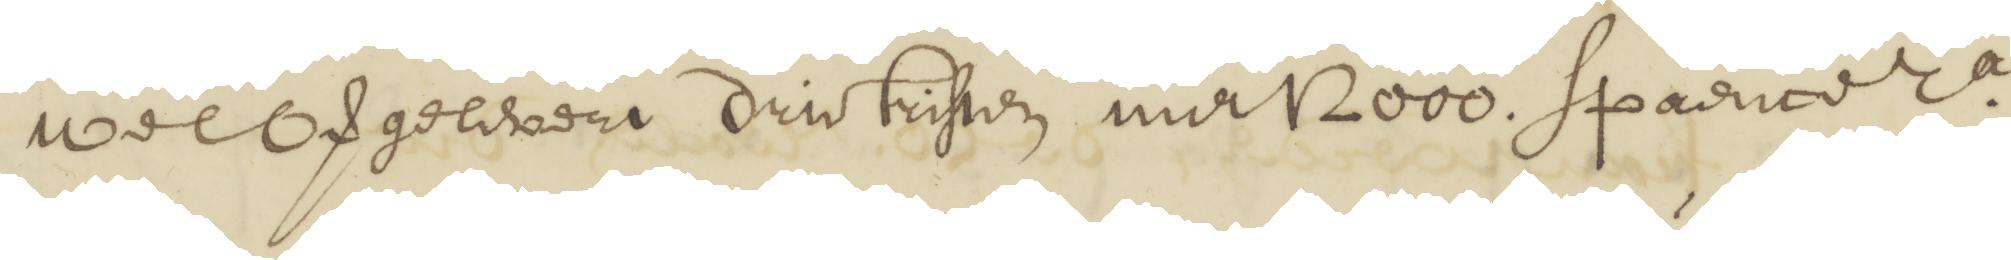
wel overgelevert drie kisten met 12000. spaence r.a,
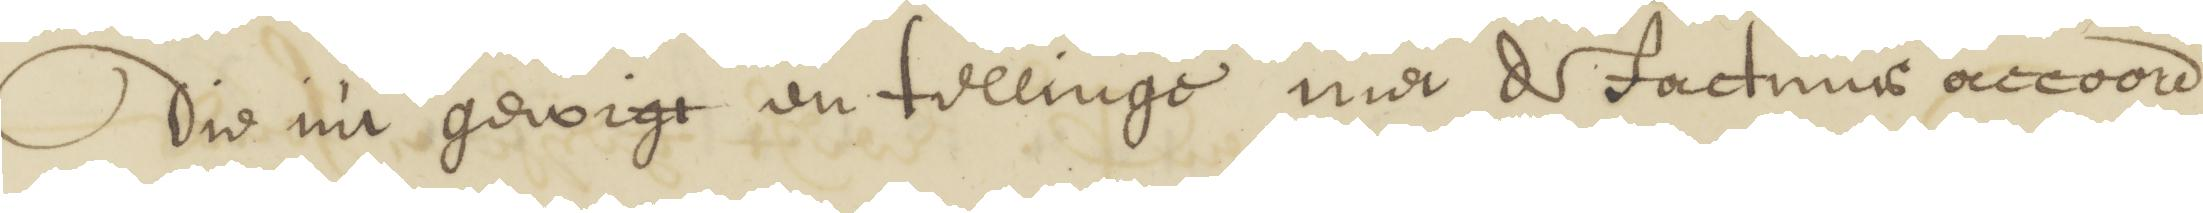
die nu gewigt en tellinge met de factuur accoord
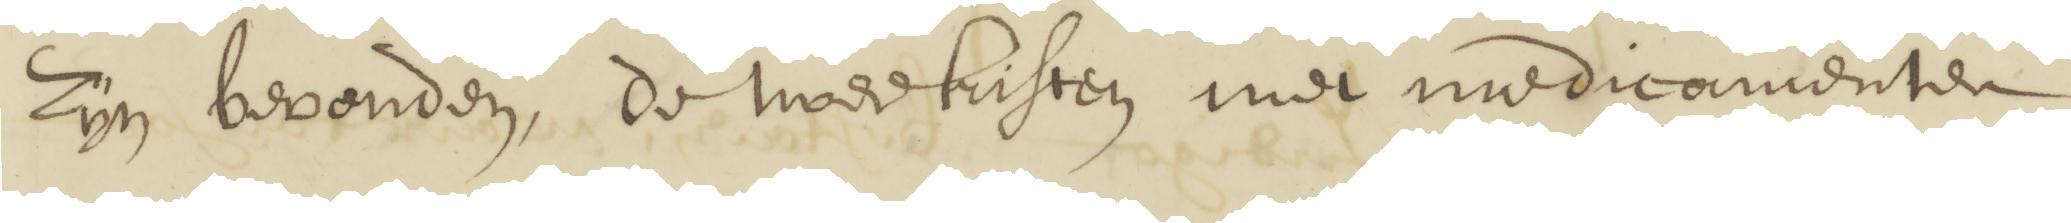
zijn bevonden, de tweekisten met medicamenten
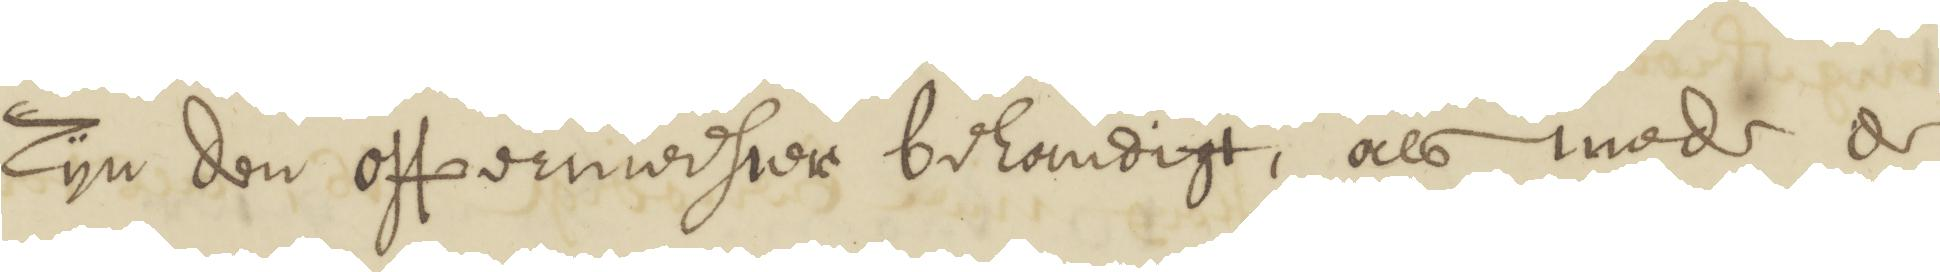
zijn den oppermeester behandigt, als mede de
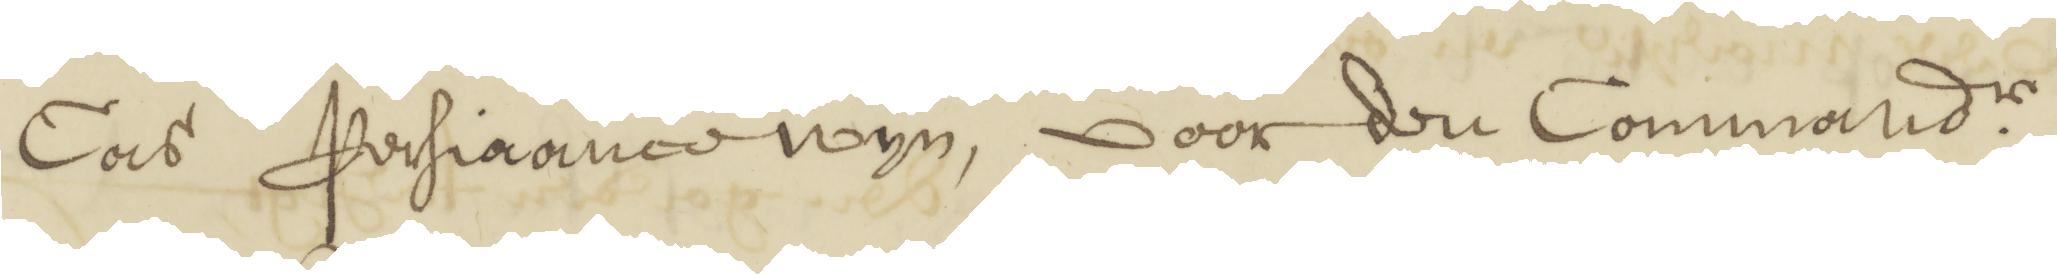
Cas persiaance wijn, voor den Command:r,
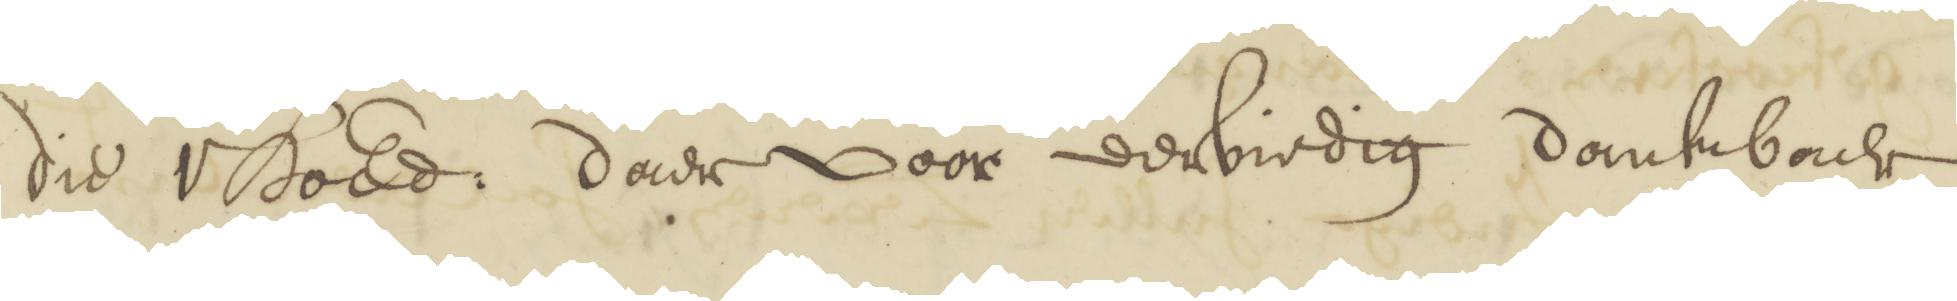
die VHoEd: daervoor eerbiedig dankbaer
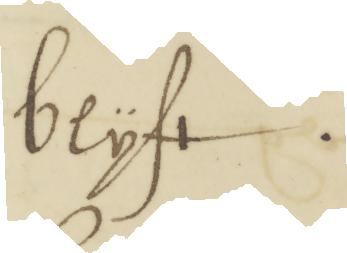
blijft.
